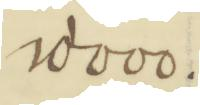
10'000.
